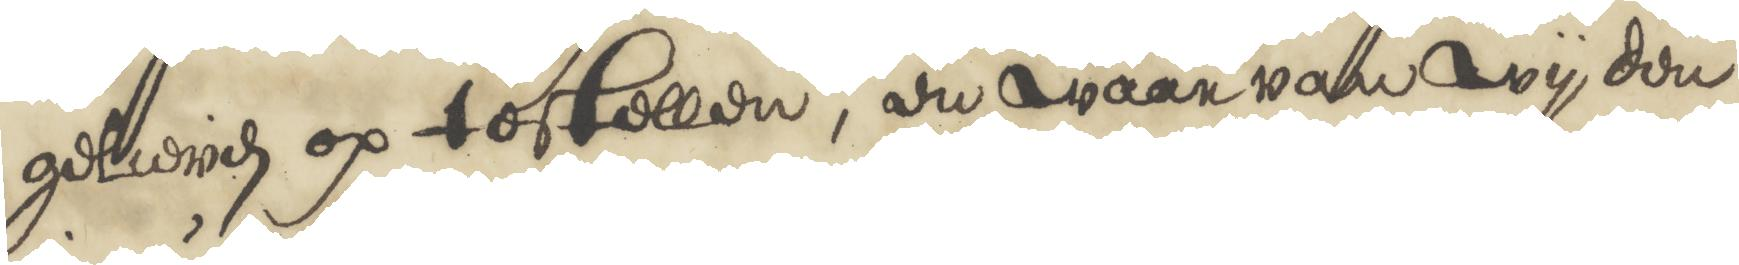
gelievien op te stellen, en waar van wij den
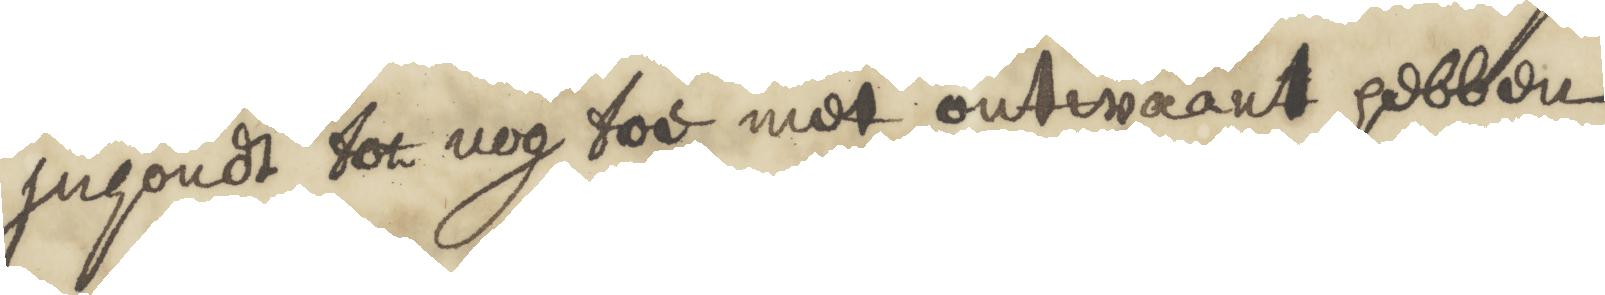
Jnhoudt tot nog toe niet ontwaart hebben
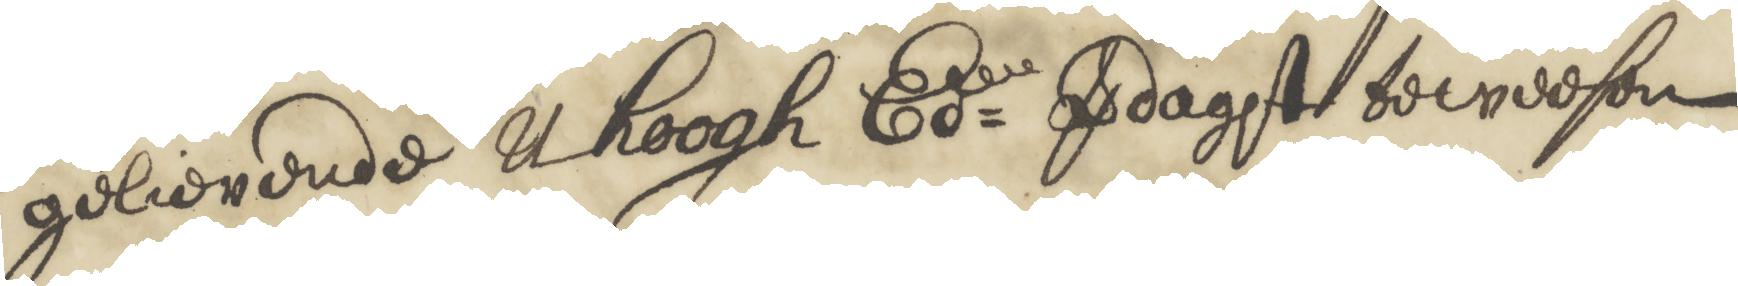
gelievende U hoogh Ed=e verdaght te weesen
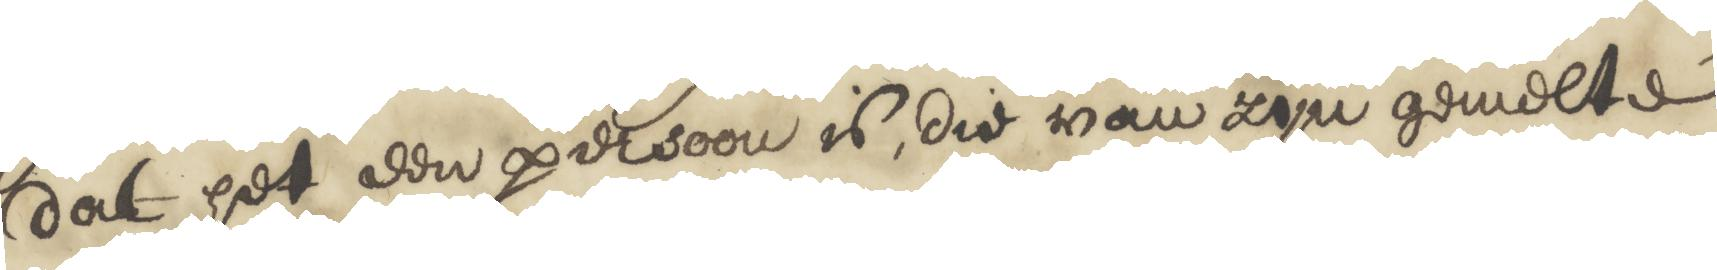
dat het een persoon is, die van zijn gemelte
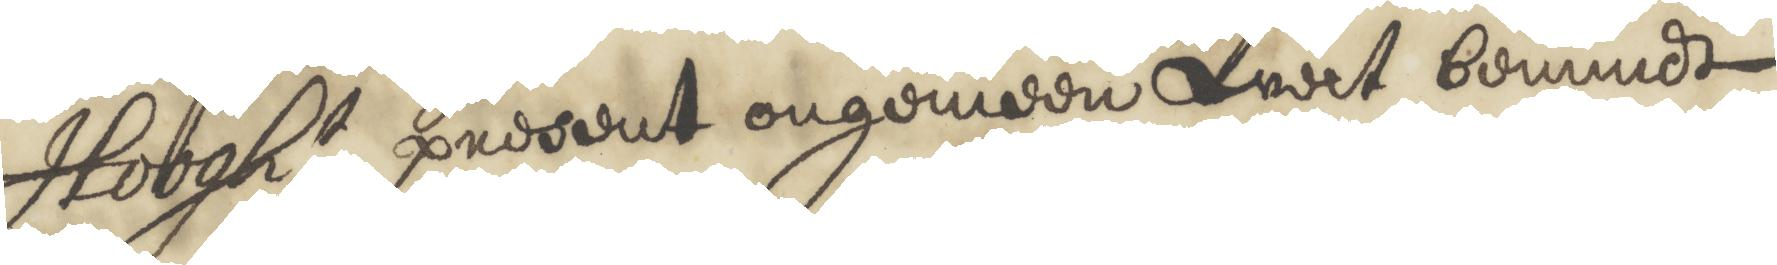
Hoogh:t present ongemeen wert bemindt
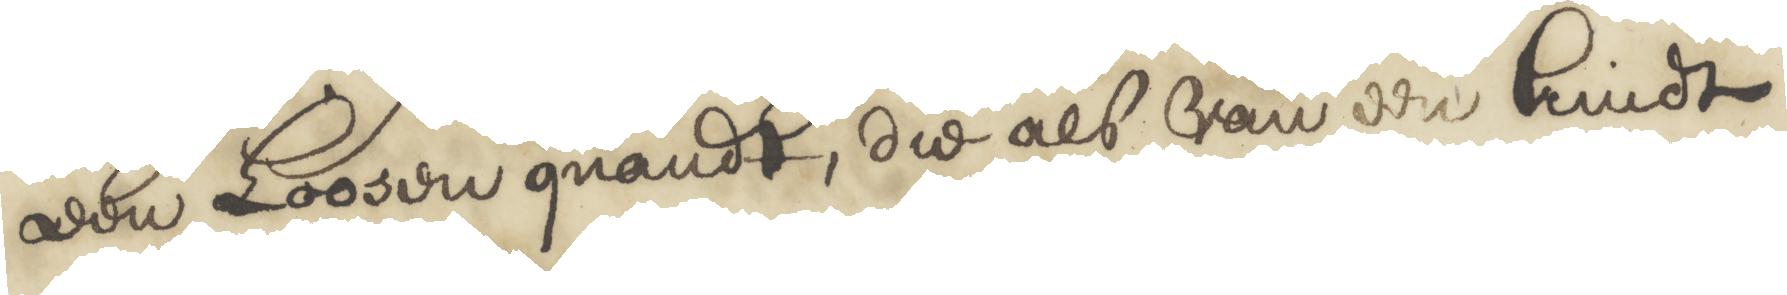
een Loosen quandt, die als van een kindt
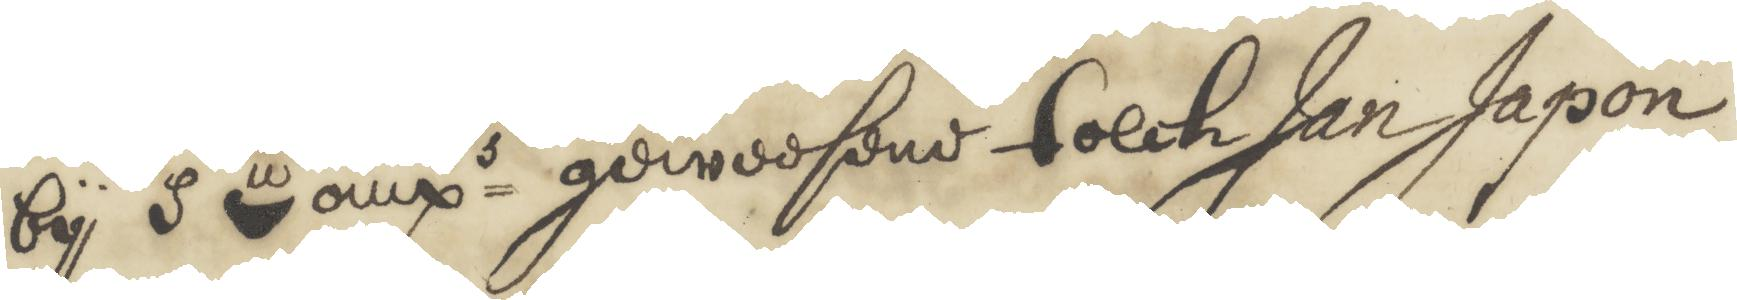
bij ’s Comp=s geweesene tolck Jan Japon
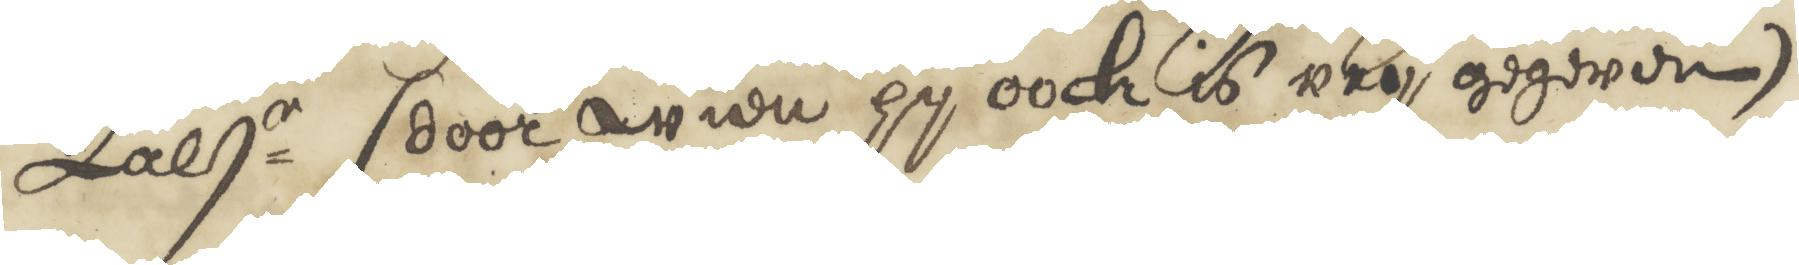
Zal=r (door wien hij oock is vrij gegeven)
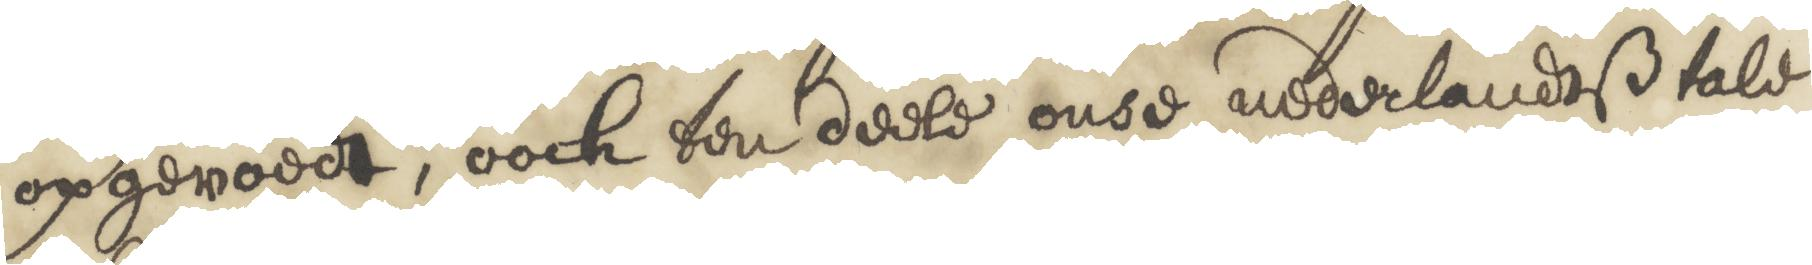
opgevoedt, oock ten deele onse nederlandtse tale
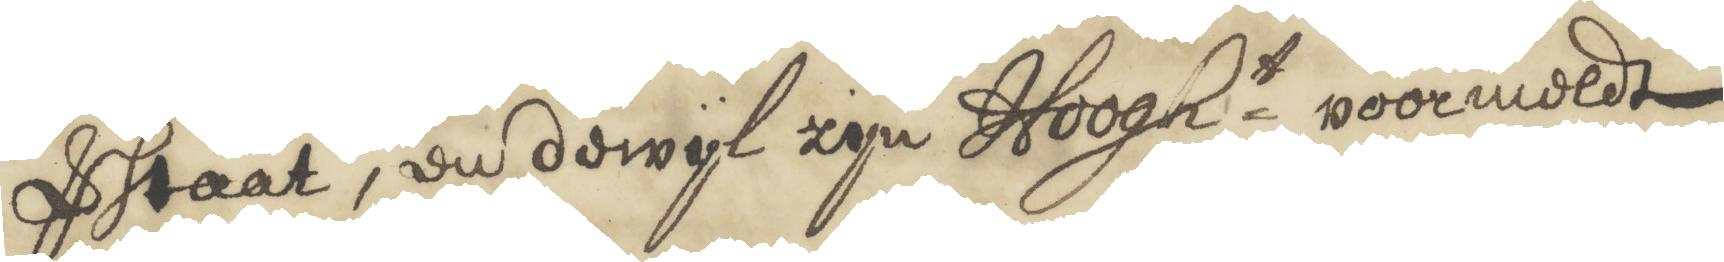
verstaat, en dewijl zijn Hoogh=t voormeldt
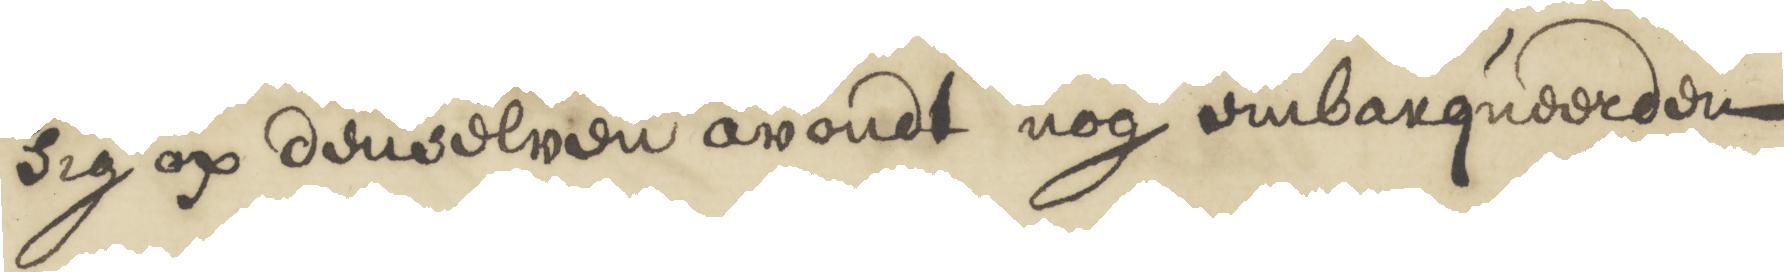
sig op denselven avondt nog embarqueerden
